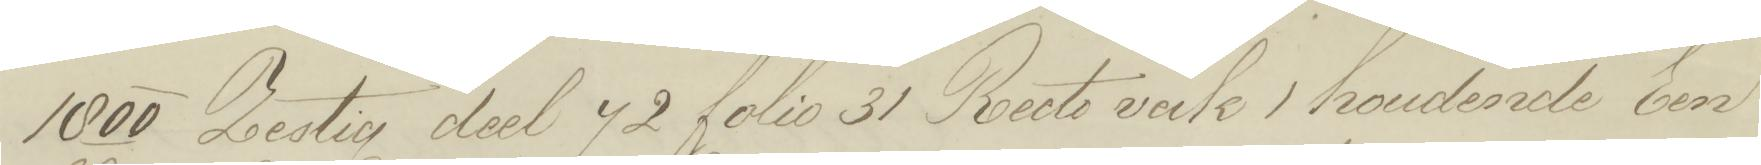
1800 Zestig deel 72 folio 31 Recto vak 1 houdende Een
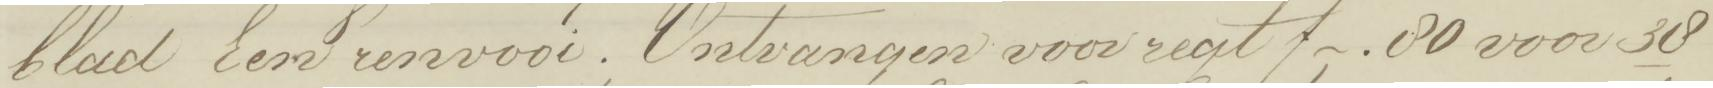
blad Een renvooi. Ontvangen voor regt ƒ ~. 80 voor 38
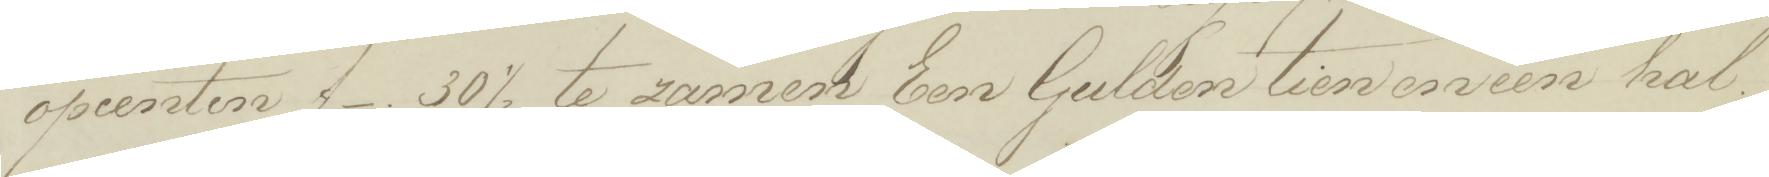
opcenten ƒ -. 30½ te zamen Een Gulden tien en een hal
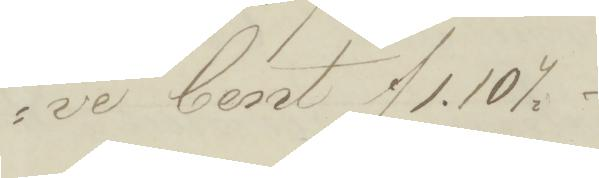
„ve Cent ƒ1.10½
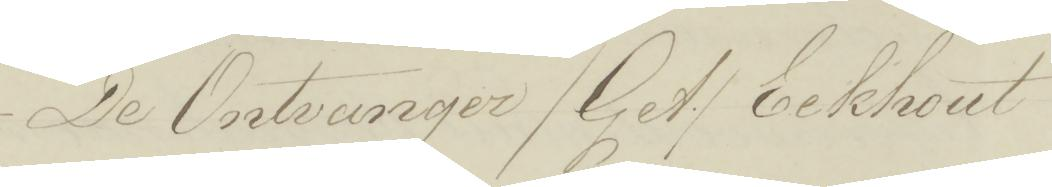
De Ontvanger /Get:/ Eekhout
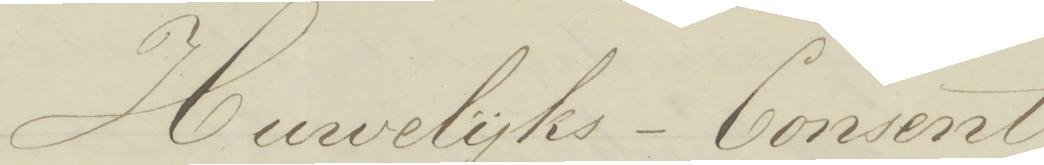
Huwelijks - Consent
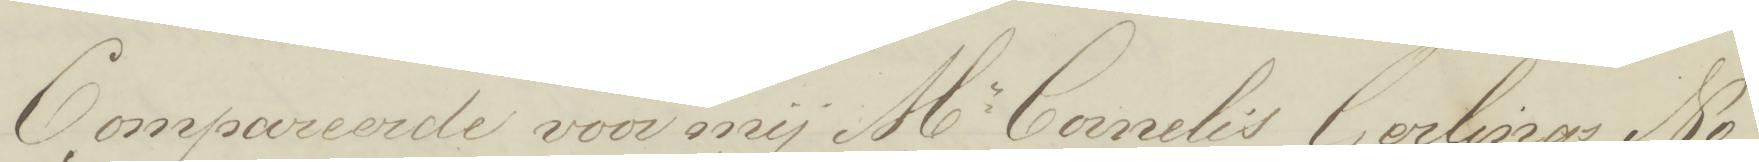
Compareerde voor mij M:r Cornelis Gerlings No:
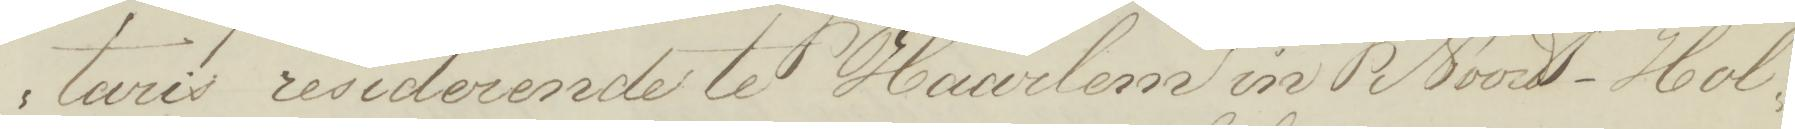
„taris residerende te Haarlem in Noord-Hol„
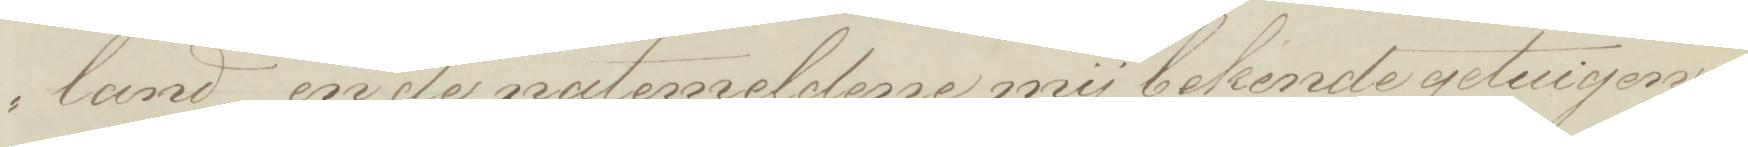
„land en de natemeldene mij bekende getuigen
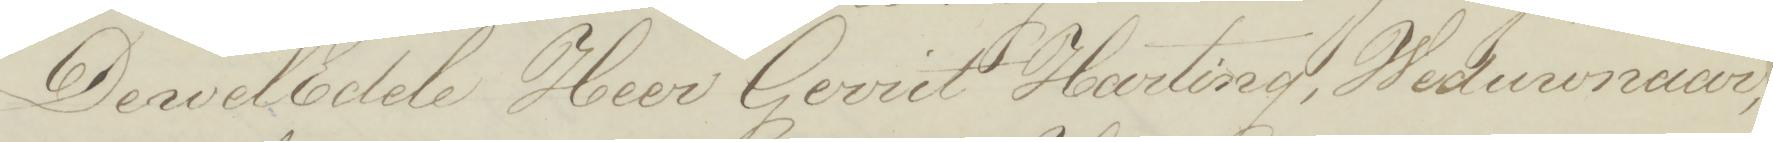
De wel Edele Heer Gerrit Harting, Weduwnaar,
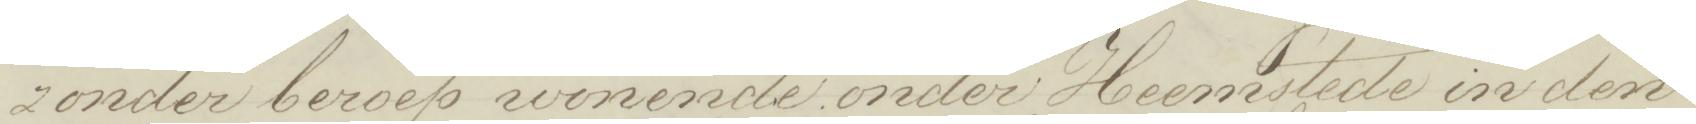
zonder beroep wonende onder Heemstede in den
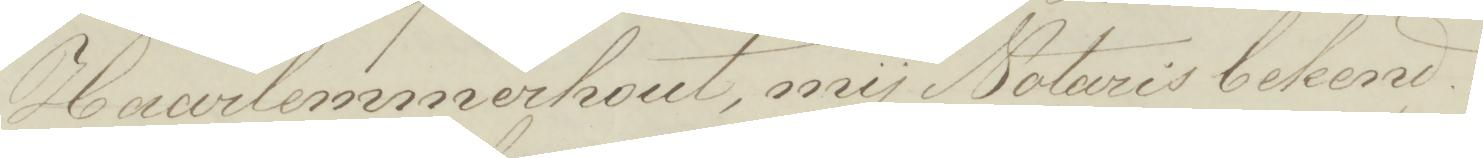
Haarlemmerhout, mij Notaris bekend.
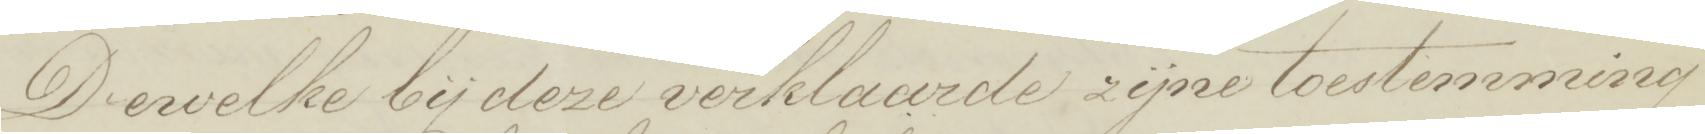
Dewelke bij deze verklaarde zijne toestemming
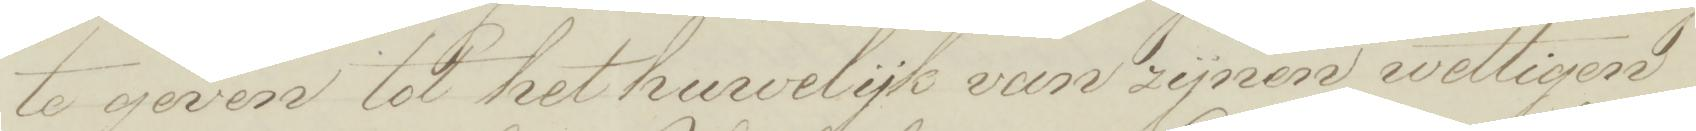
te geven tot het huwelijk van zijnen wettigen
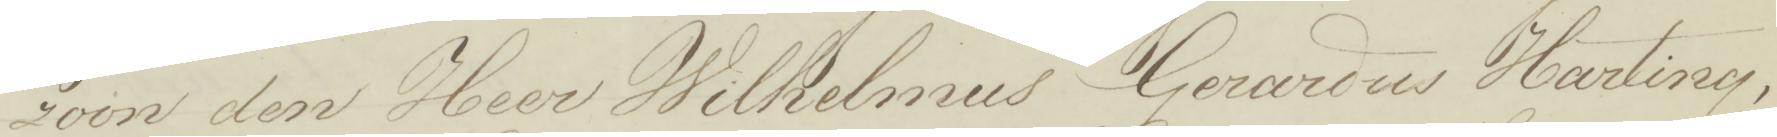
zoon den Heer Wilhelmus Gerardus Harting,
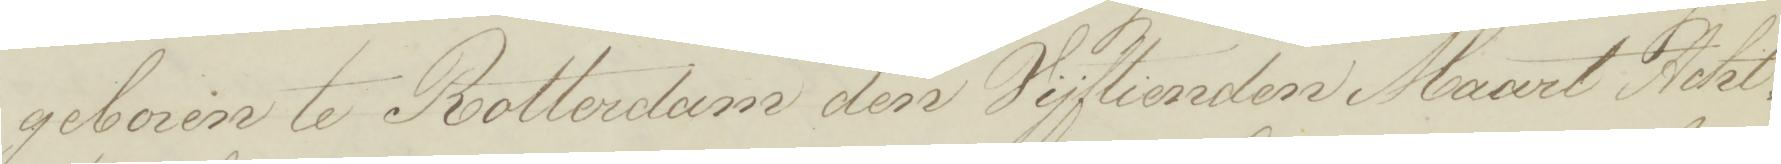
geboren te Rotterdam den Vijftienden Maart Acht„
